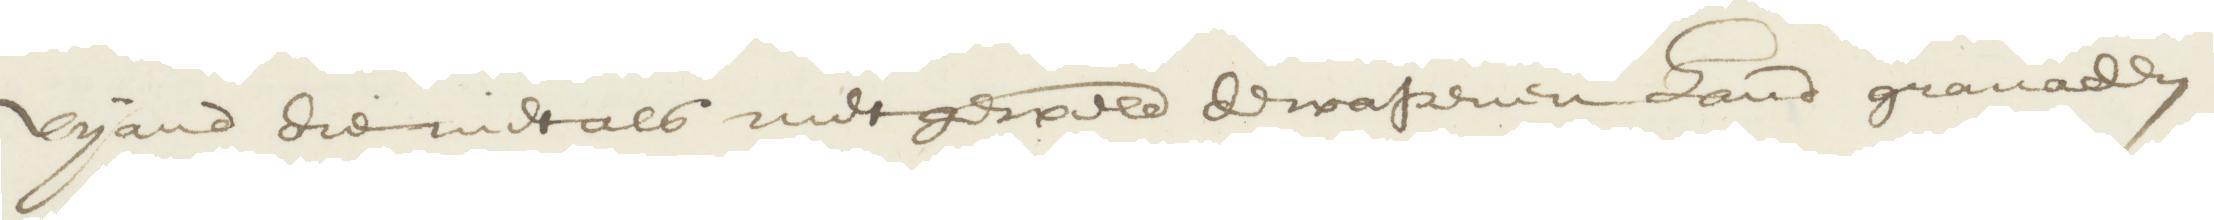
vijand die nietals met geweld de wapenen hand granaden
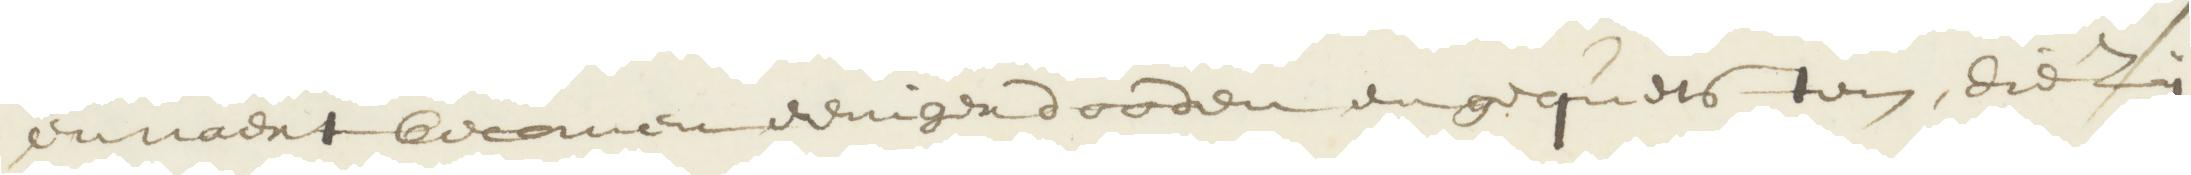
en naert becomen eenigen dooden en gequetsten, die Zij
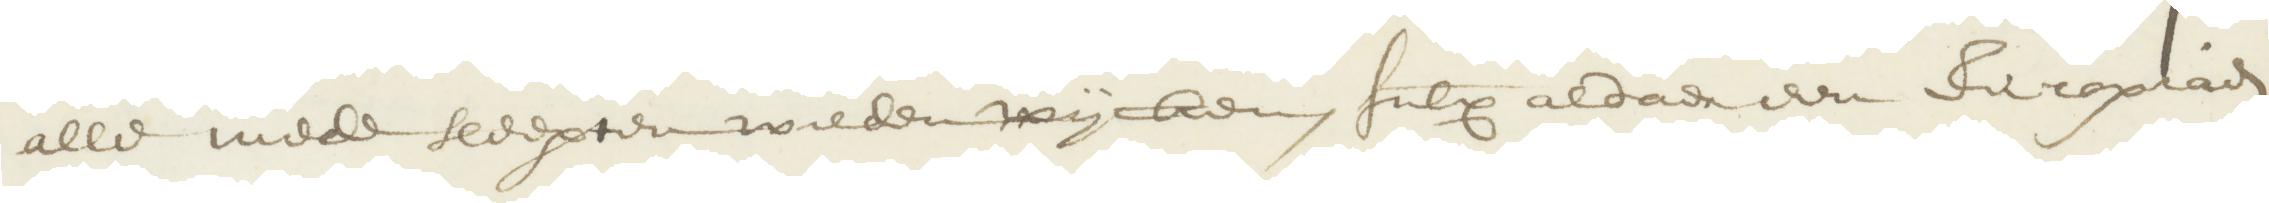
alle mede sleepten wilden wijcken, sulx aldaer een Europiaen
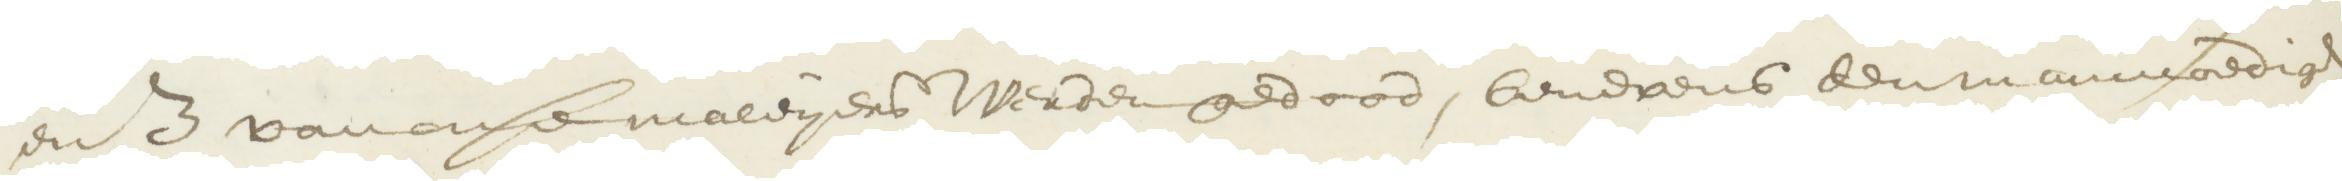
en 3 van onse maleijers Werden gedood, benevens den manmoedigen
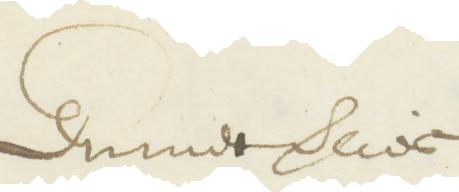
En met verlies
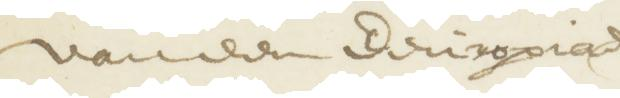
van een Eeuropian
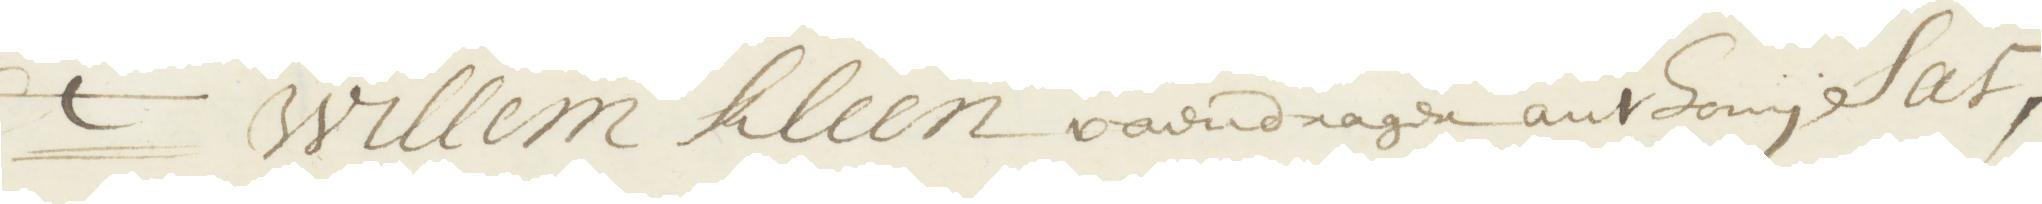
Willem kleen vaendrager anthonij Sas
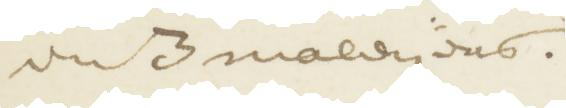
en 3 maleijers.
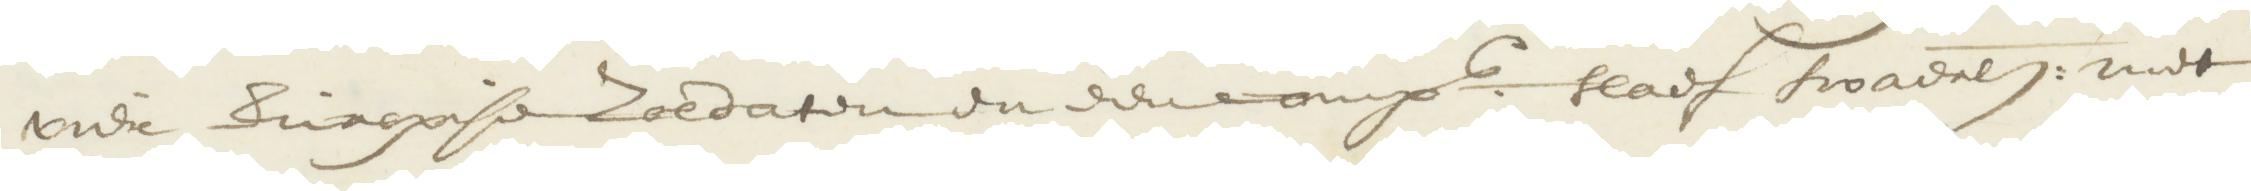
vier Europise Zoldaten en een comp:s slaef swaerlijk met
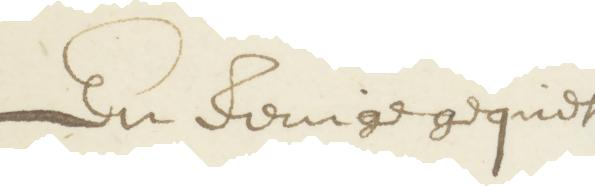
en Eenige geques
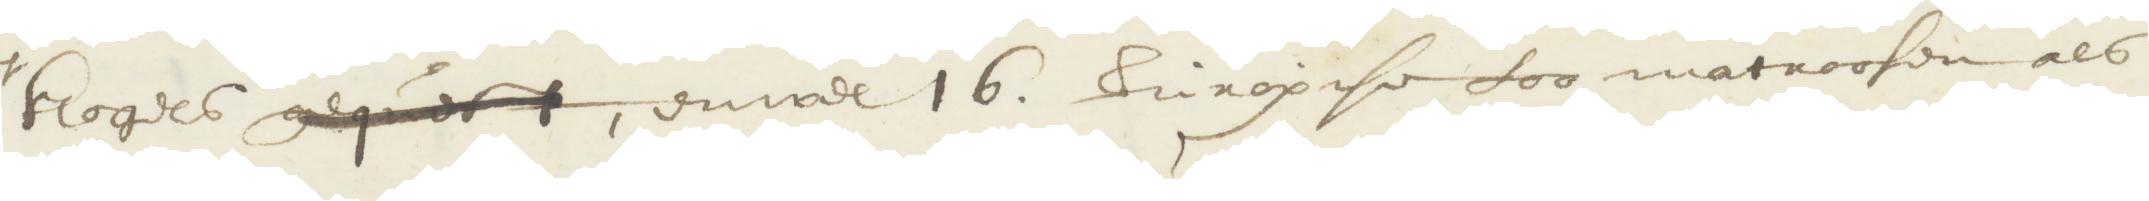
kogels gequest, enwel 16. Europise soo matroosen als
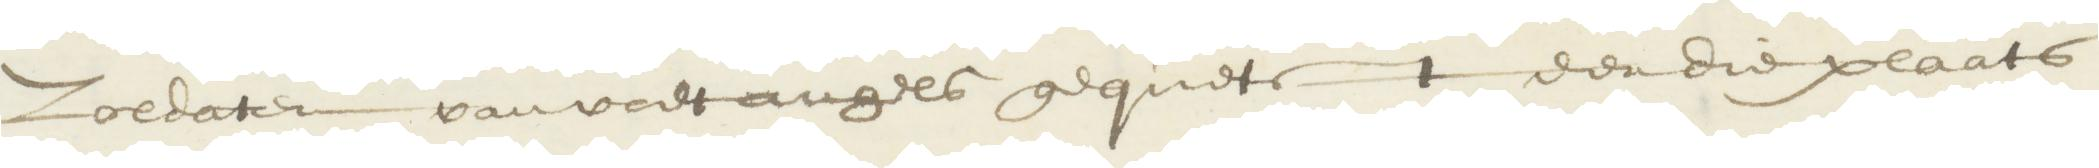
Zoldaten van voetangels gequetst eer die plaats
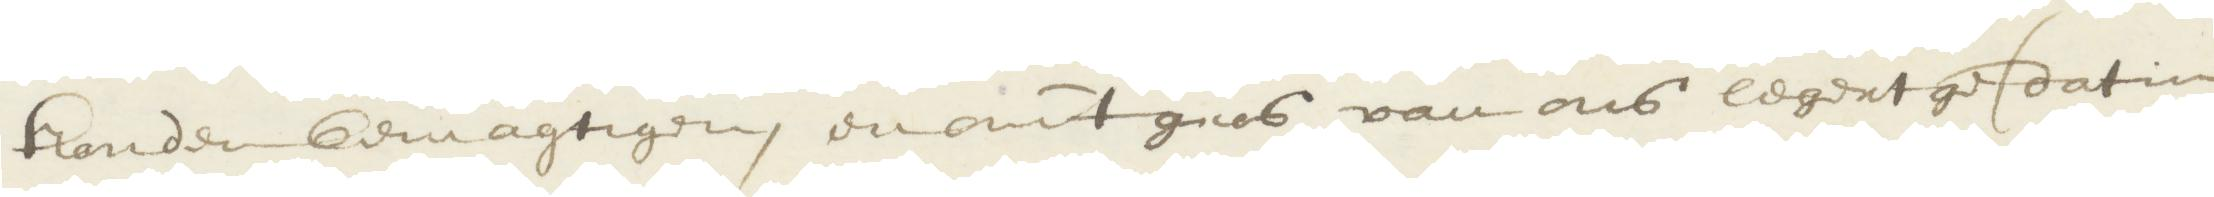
konden bemagtigen, en om ’t gros van ons legert ge(datin
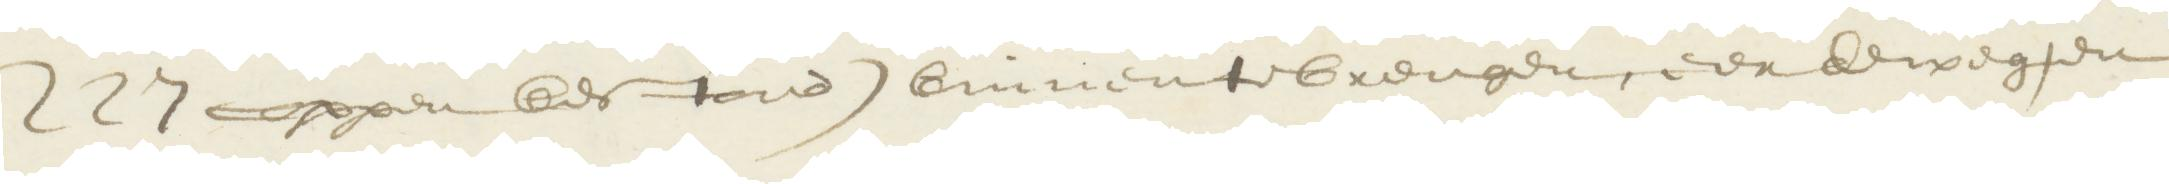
227 coppen bestond) binnen tebrengen, eer de weg/en
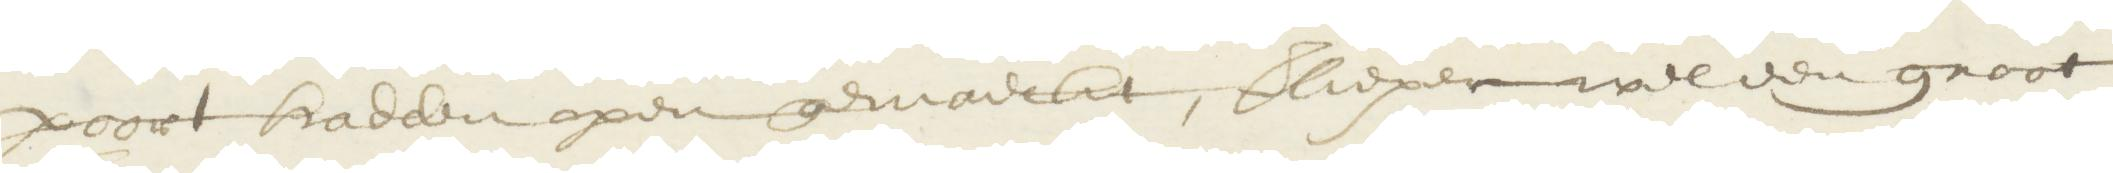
poort hadden open gemaeckt, verliepen wel een groot
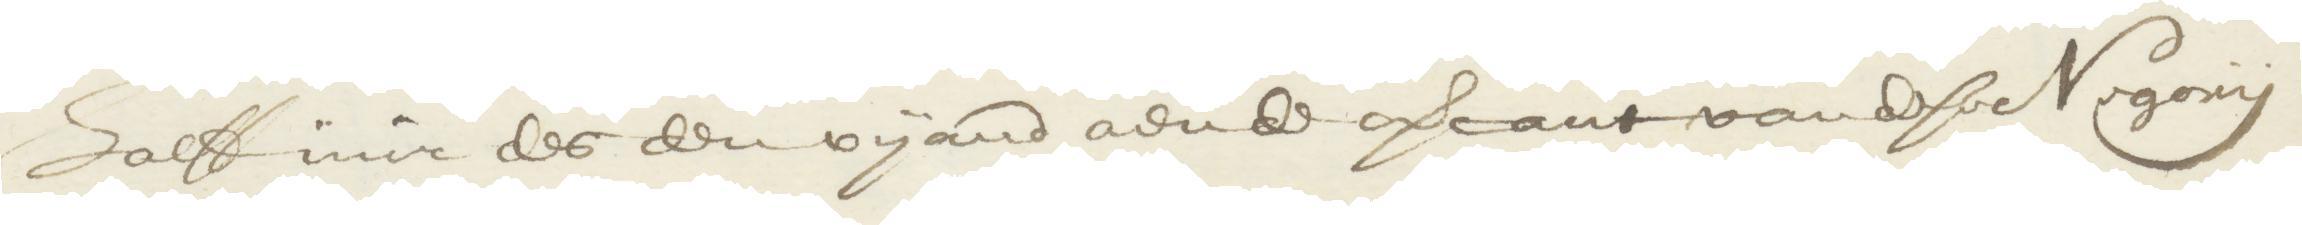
halff uur des den vijand aende overcant van dese Negorij
